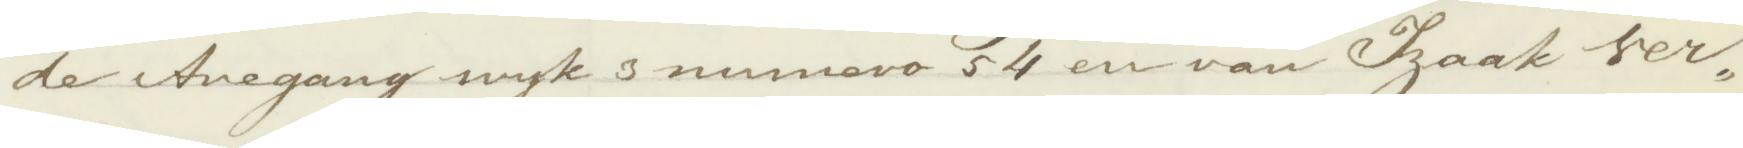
de Anegang wyk 3 numero 54 en van Izaak Ver„
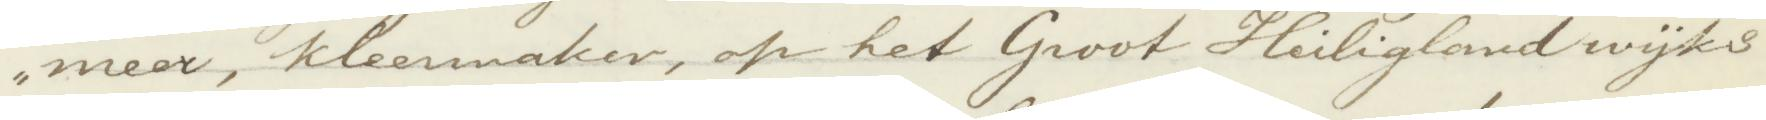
„meer, kleermaker, op het Groot Heiligland wijk 3
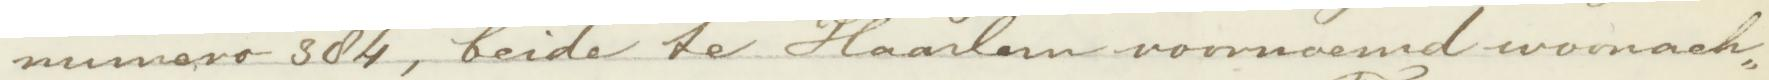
numero 384, beide te Haarlem voornoemd woonach„
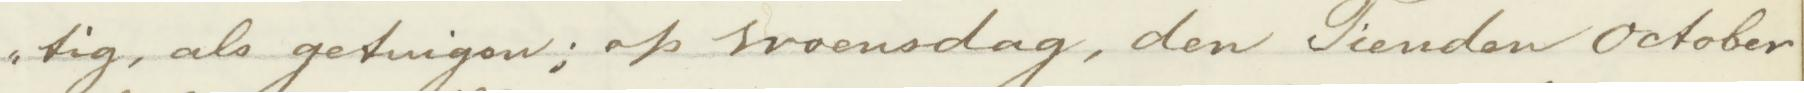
„tig, als getuigen; op woensdag, den Tienden October
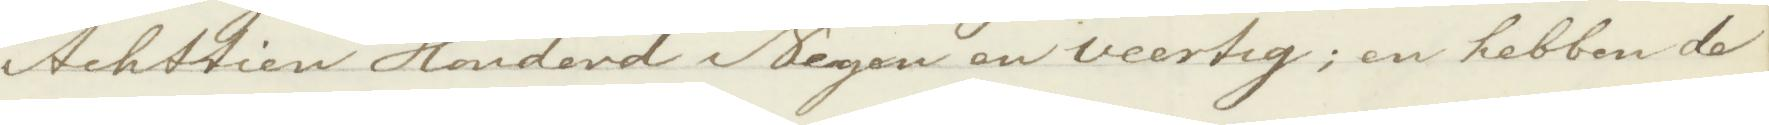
Achttien Honderd Negen en veertig; en hebben de
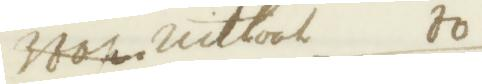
38opc uitloot 80
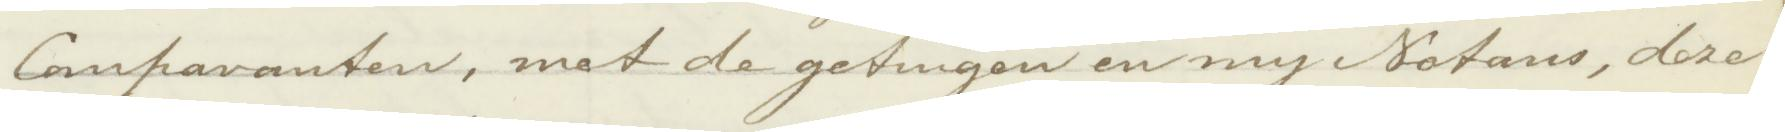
Comparanten, met de getuigen en my Notaris, deze
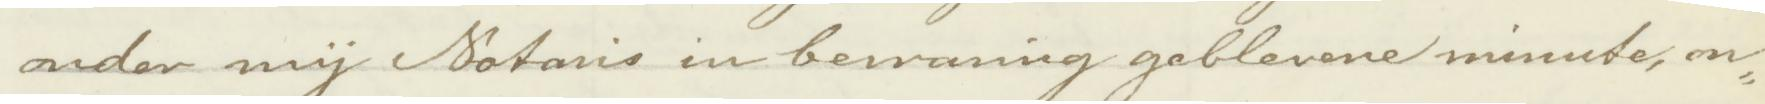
onder mij Notaris in bewaring geblevene minute, on„
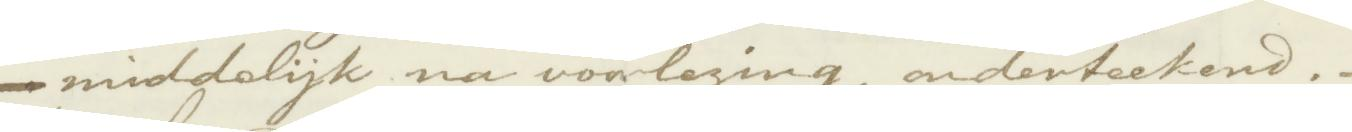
middelijk na voorlezing, onderteekend.
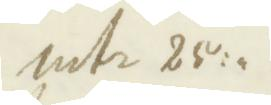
intr 25: „
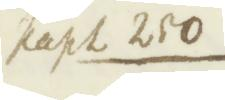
kapt 250
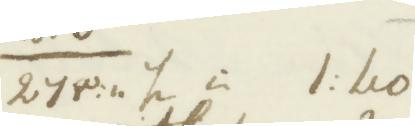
278: „ ½ is 1:40
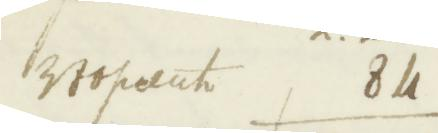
38 opcenten 84
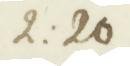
2: 20
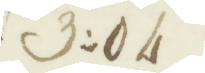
ƒ 3:04
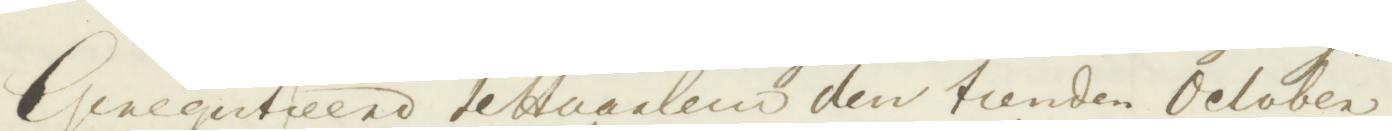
Geregistreerd te Haarlem den tienden October
